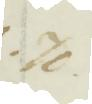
1.70.
